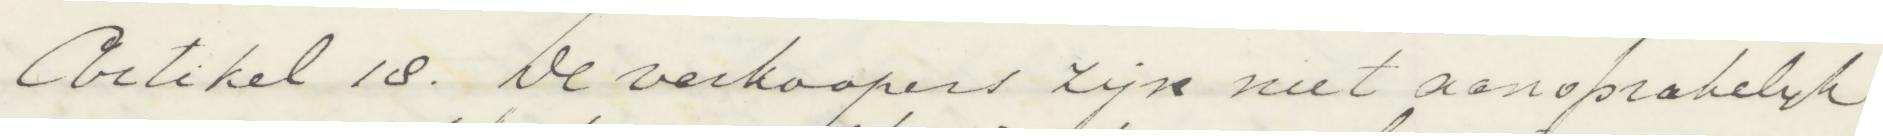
Artikel 18. De verkoopers zijn niet aansprakelyk
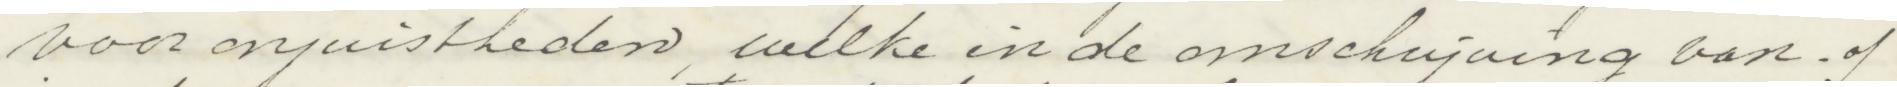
voor onjuistheden, welke in de omschrijving van- of
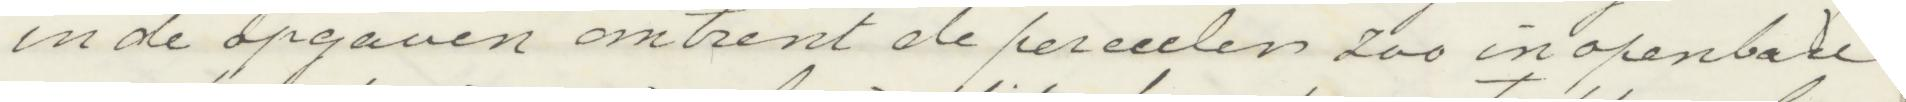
in de opgaven omtrent de perceelen zoo in openbare
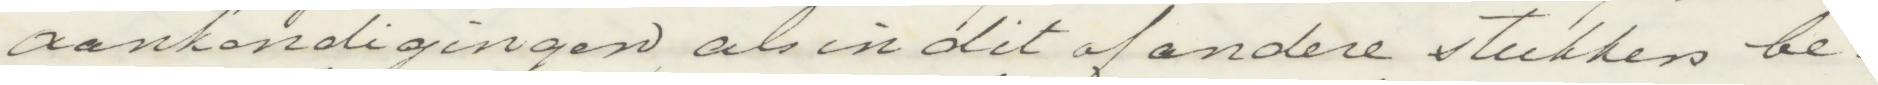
aankondigingen als in dit of andere stukken be-
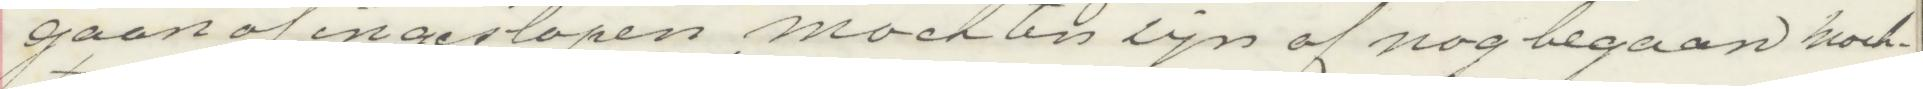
gaan of ingeslopen mochten zijn of nog begaan moch-
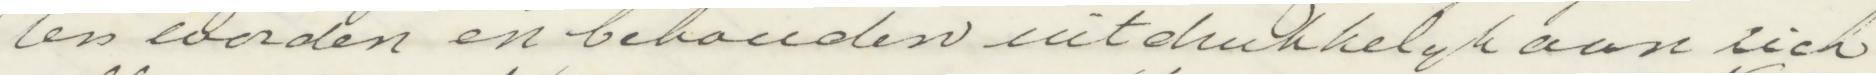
ten worden en behouden uitdrukkelyk aan zich
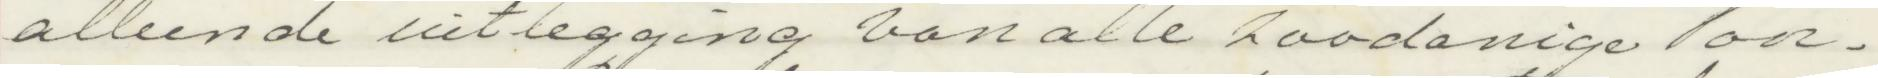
alleen de uitlegging van alle zoodanige Voor-
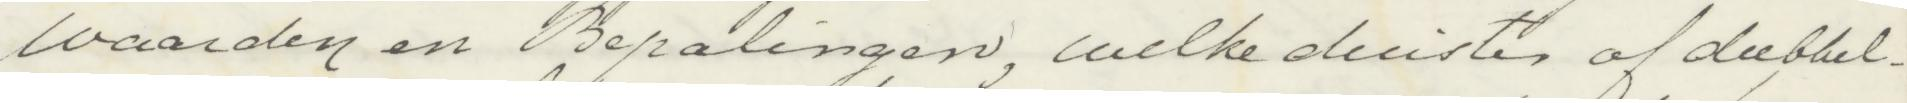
waarden en Bepalingen, welke duister of dubbel-
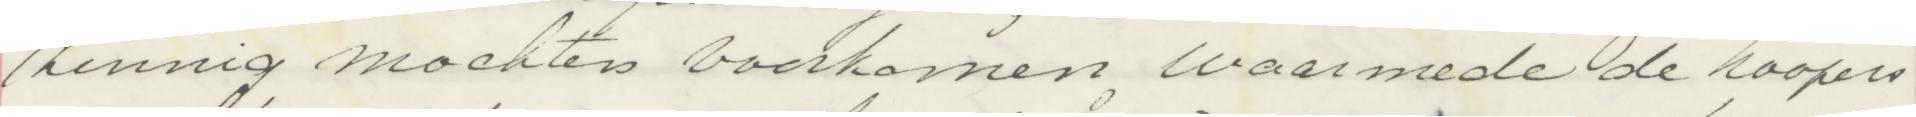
zinnig mochten voorkomen, waarmede de koopers
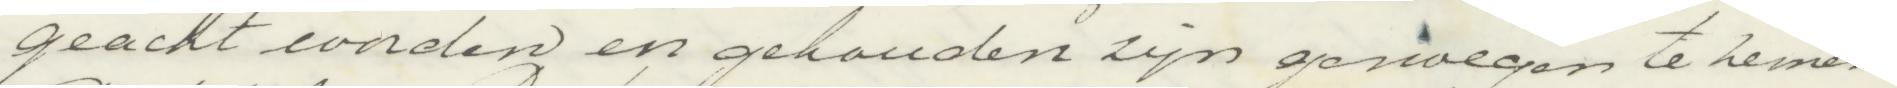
geacht worden en gehouden zijn genoegen te nemen
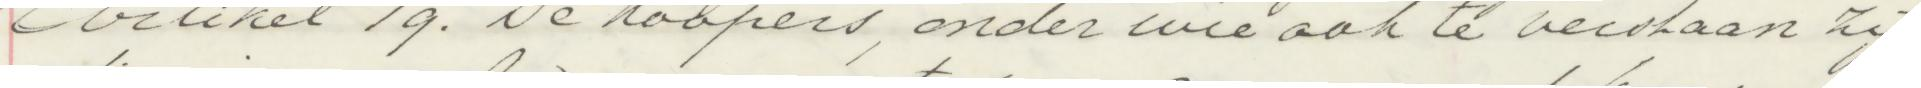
Artikel 19. De koopers, onder wie ook te verstaan zij,
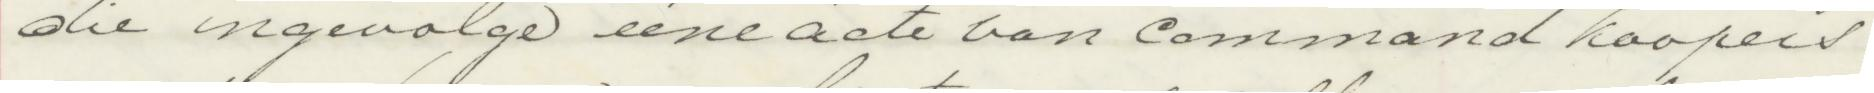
die ingevolge eene acte van command koopers
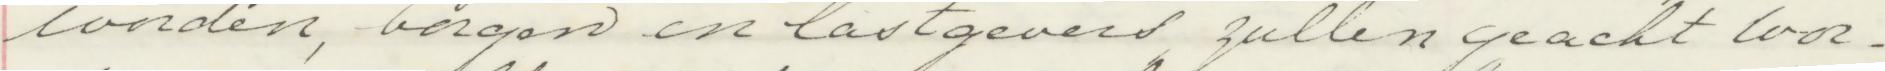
worden, borgen en lastgevers zullen geacht wor-
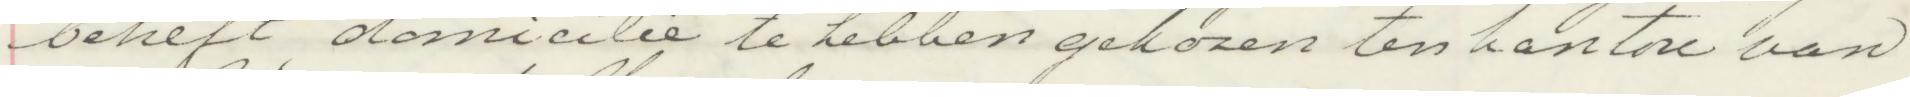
betreft, domicilie te hebben gekozen ten kantore van
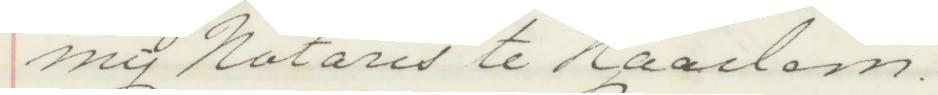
mij Notaris te Haarlem.
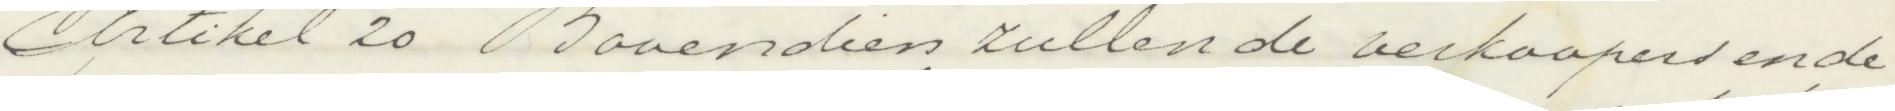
Artikel 20 Bovendien zullen de verkoopers en de
